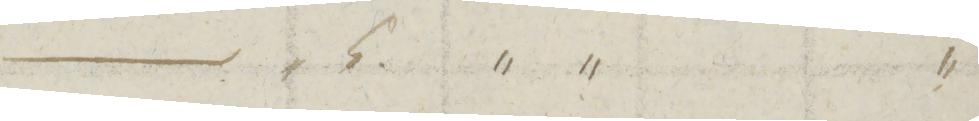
— „ 5. „ „ „
